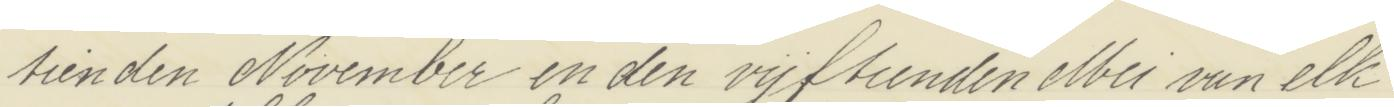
tienden November en den vijftienden Mei van elk
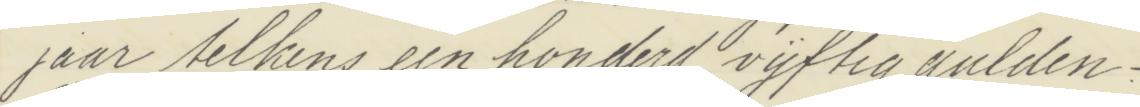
jaar telkens een honderd vijftig gulden
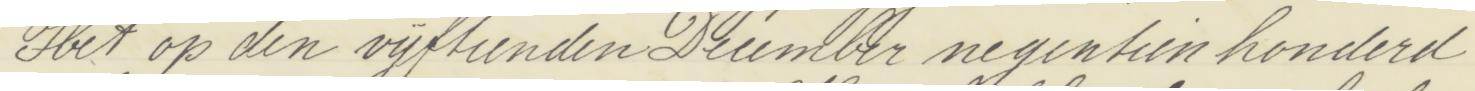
Het op den vijftienden December negentien honderd
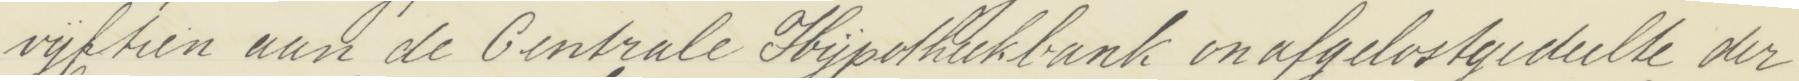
vijftien aan de Centrale Hijpotheekbank onafgelostgedeelte der
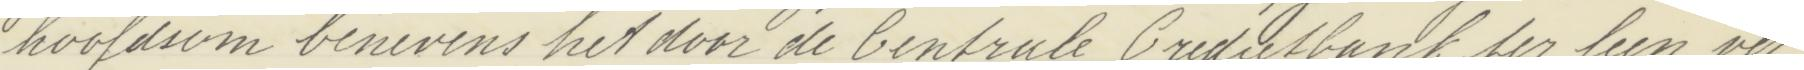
hoofdsom benevens het door de Centrale Creduiebank ter leen ver
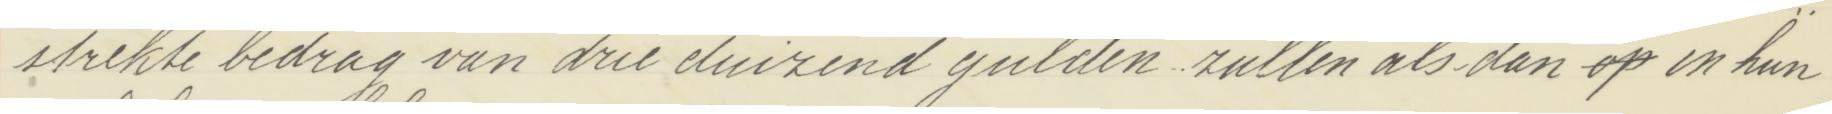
strekte bedrag van drie duizend gulden zullen als dan op in hun
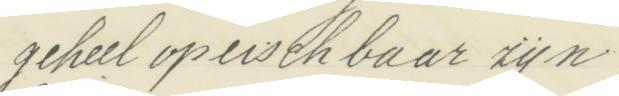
geheel opeischbaar zijn
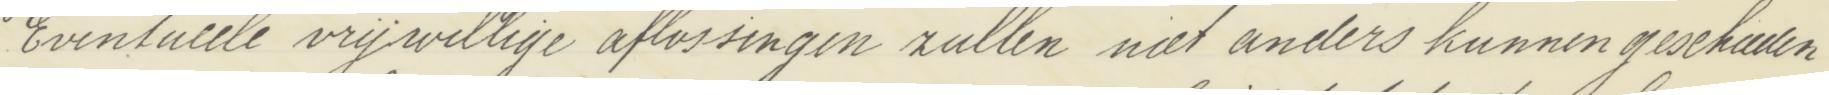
Eventuelle vrijwillige aflossingen zullen niet anders kunnen geschieden
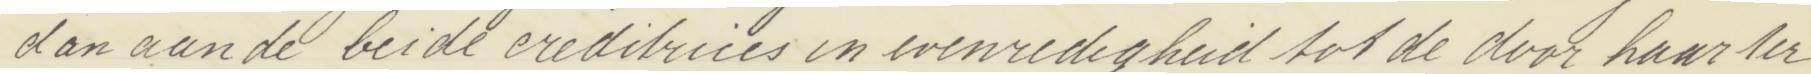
dan aan de beide creditrices in evenredigheid tot de door haar ter
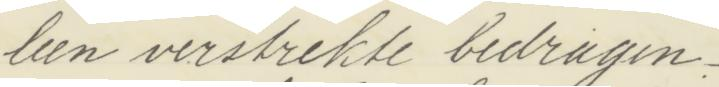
leen verstrekte bedragen
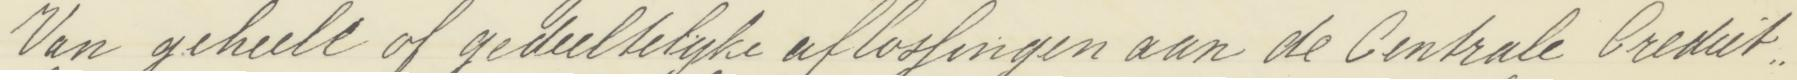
Van geheele of gedeeltelijke aflossingen aan de Centrale Crediet„
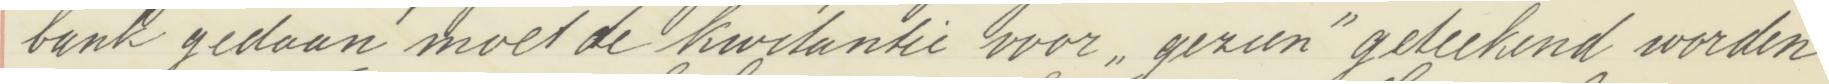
bank gedaan moet de kwitantie voor „ gezien " geteekend worden
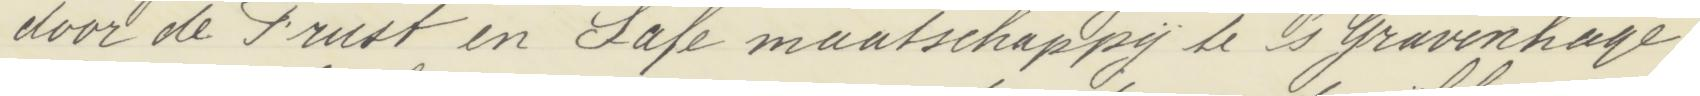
door de Trust en Safe maatschappij te 's Gravenhage
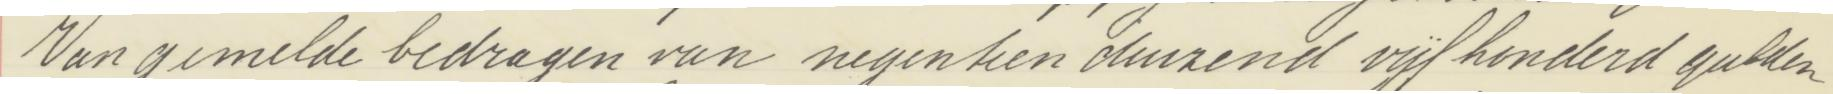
Van gemelde bedragen van negentien duizend vijf honderd gulden
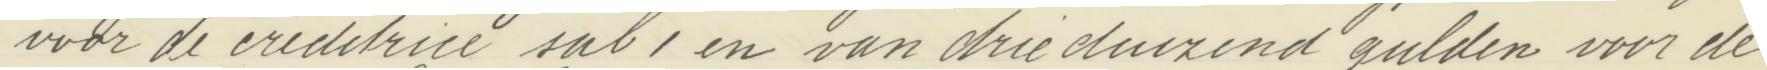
voor de creditrice sub 1 en van drie duizend gulden voor de
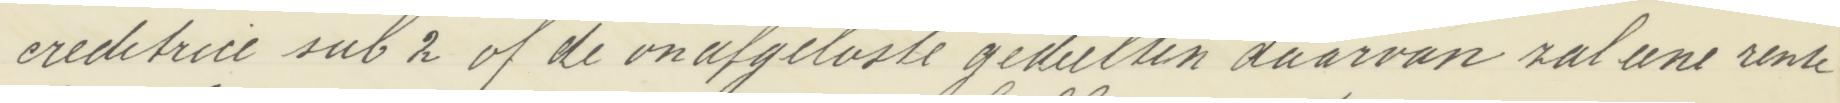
creditrice sub 2 of de onafgeloste gedeelten daarvan zal eene rente
